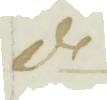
d_o
